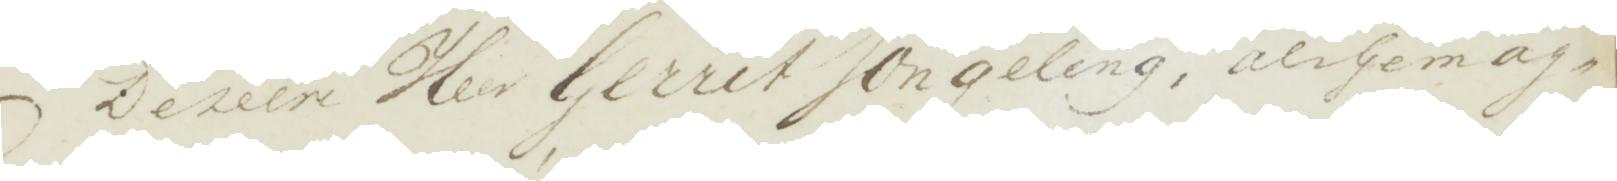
Dezelve Heer Gerrit Jongeling, als Gemag„
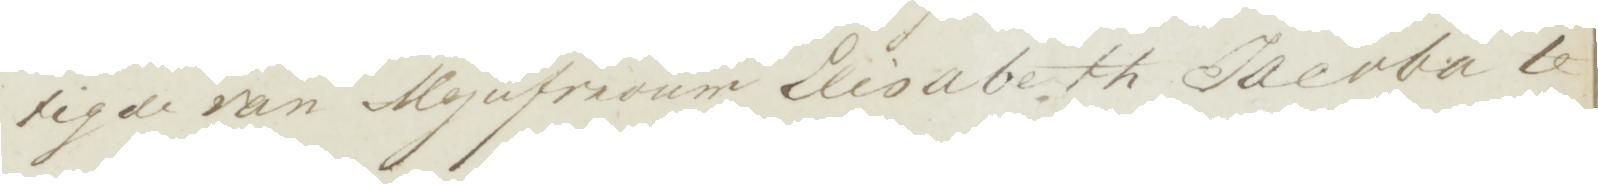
tigde van Mejufvrouw Elisabeth Iacoba te
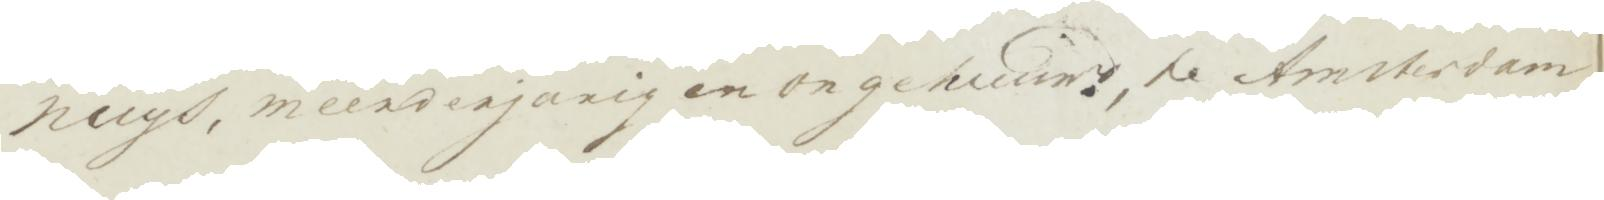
nuijs, meerderjarig en ongehuuwd, te Amsterdam
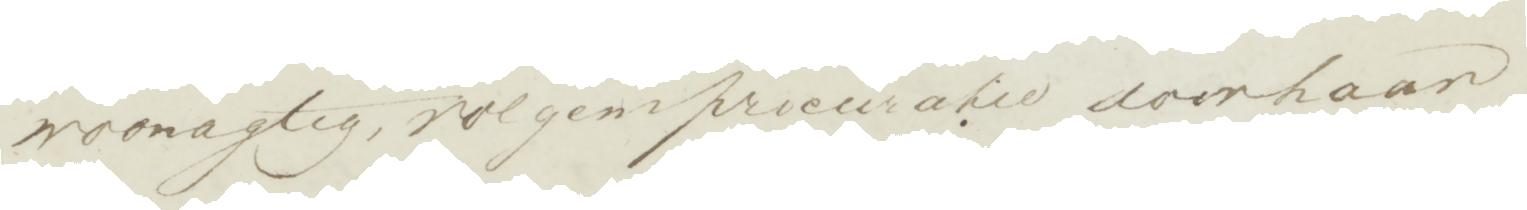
woonagtig, volgens procuratie door haar
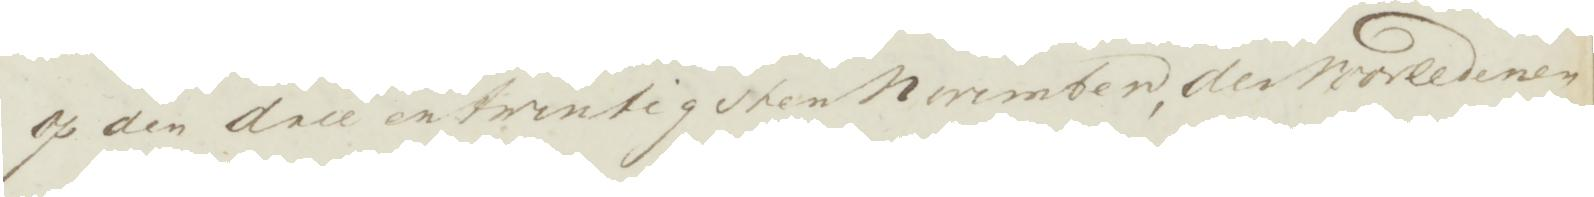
op den drie en twintigsten november, des voorledenen
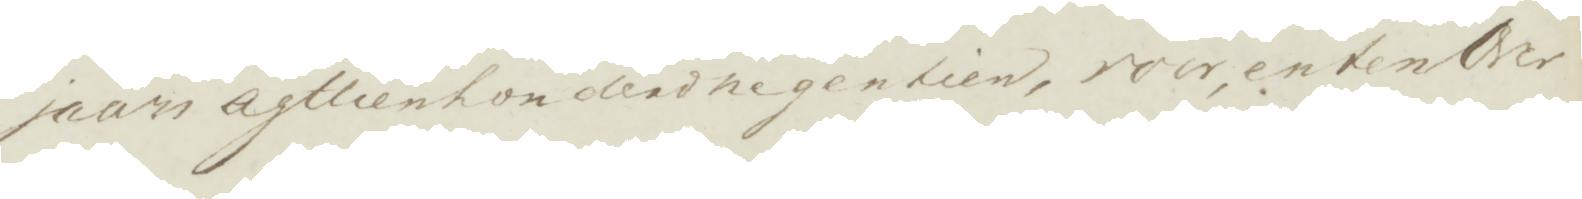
jaars agttienhonderdnegentien, voor, en ten Over
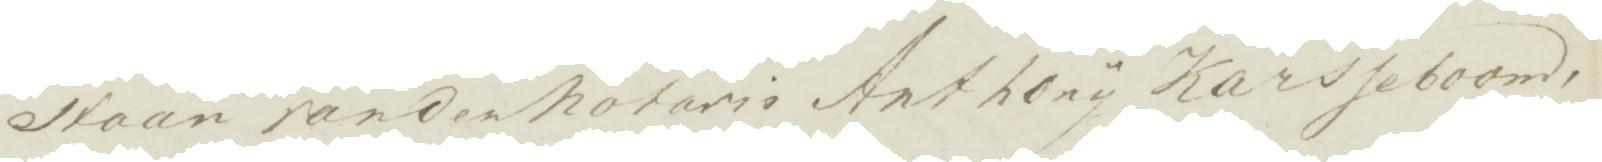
staan van den Notaris Anthonij Karsjeboom,
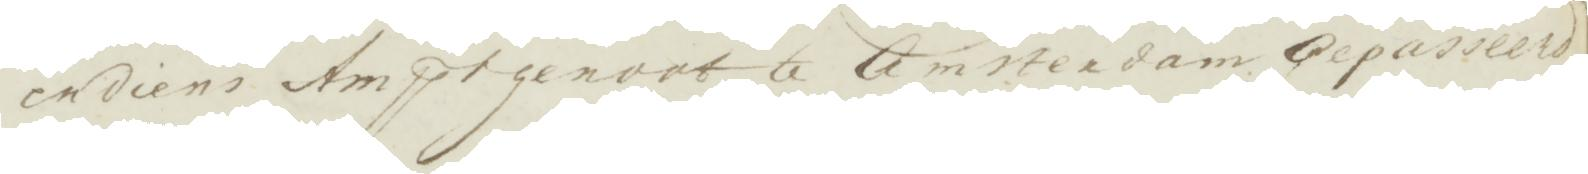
en diens Amptgenoot, te Amsterdam gepasseerd,
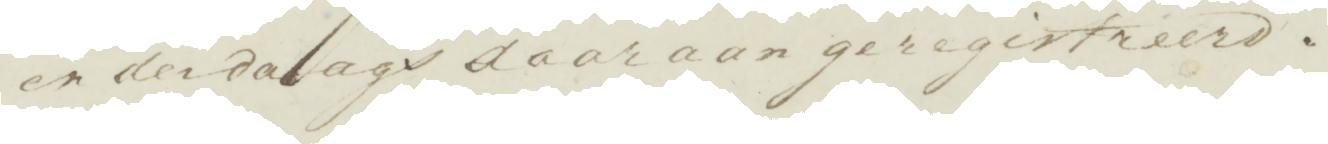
en des daags daar aan geregistreerd.
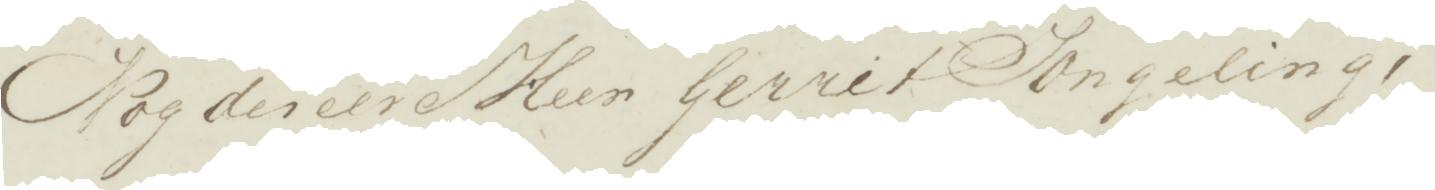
Nog deselve Heer Gerrit Jongeling,
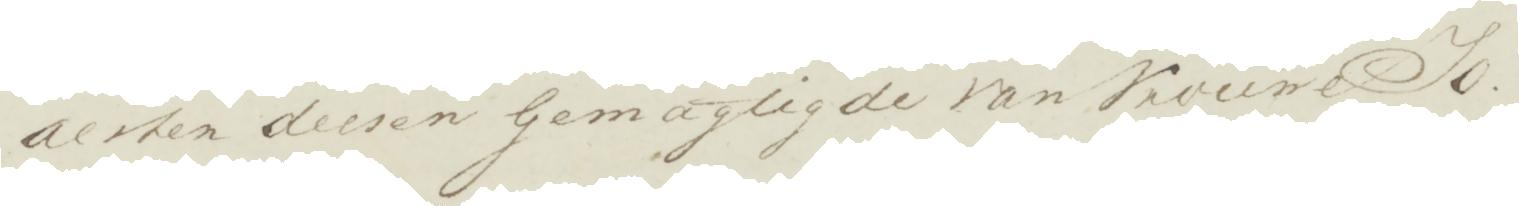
alsten deesen Gemagtigde van Vrouwe Jo.
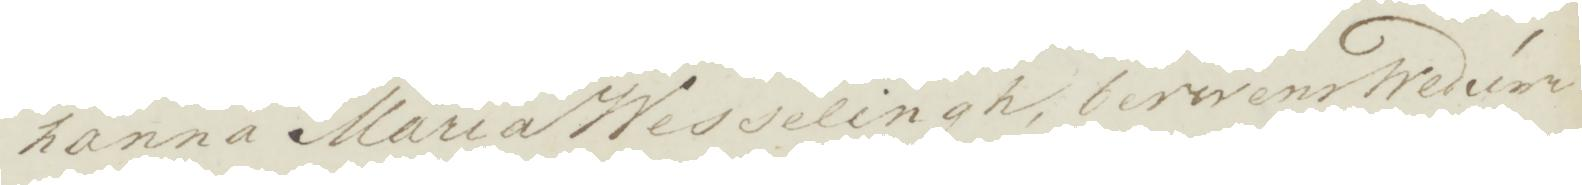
hanna Maria Wesselingh, bevorens weduwe
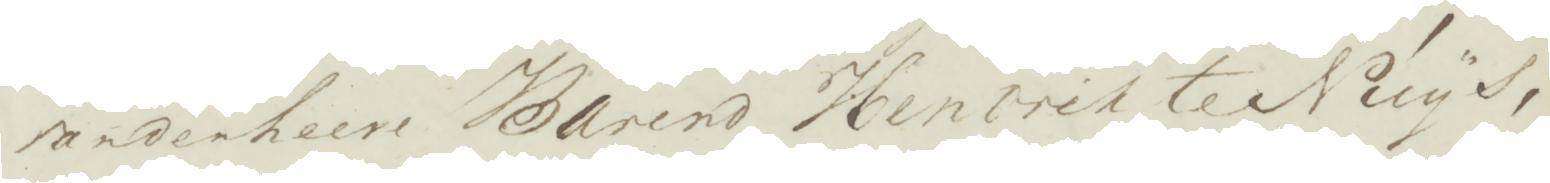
vanden heere Barend Hendrik te Nuijs,
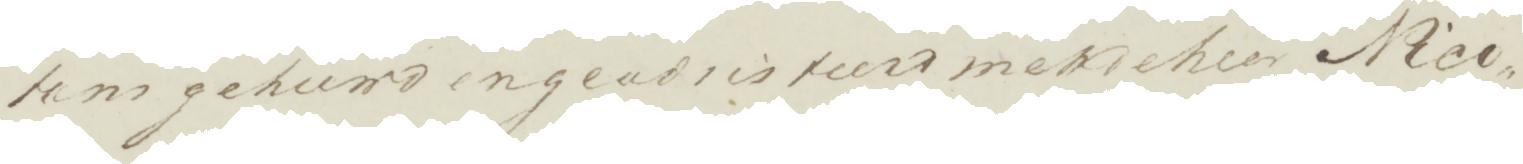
tans gehuwd en geadsisteerd met de heer Nico„
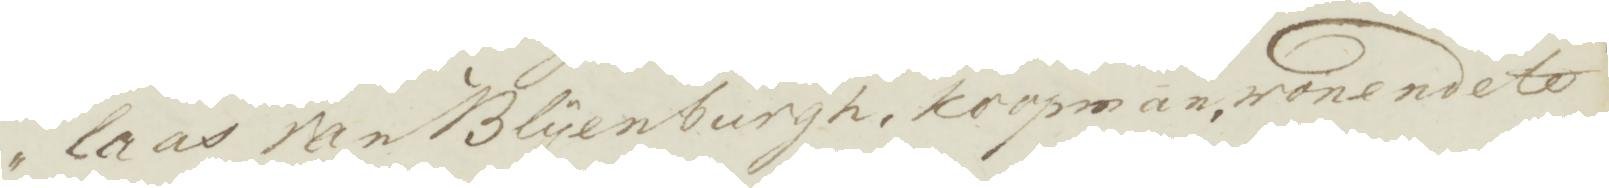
„laas van Blijenburgh, koopman, wonende te
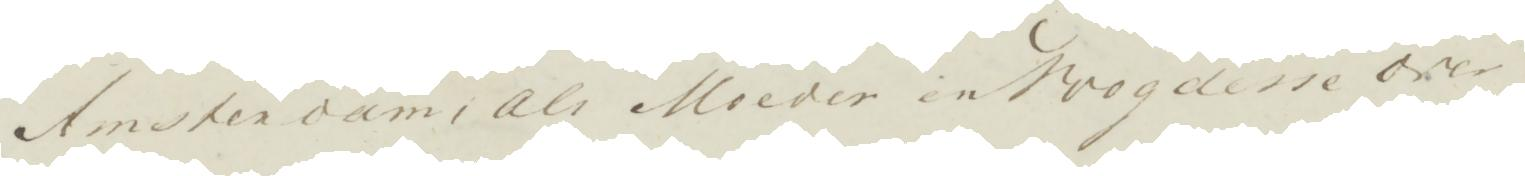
Amsterdam, als Moeder en Voogdesse over
